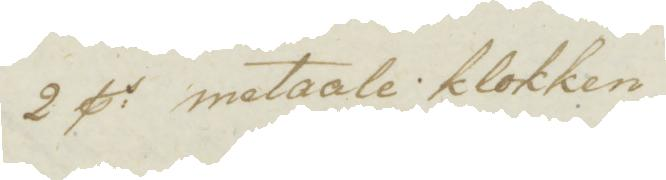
2 p:s metaale klokken
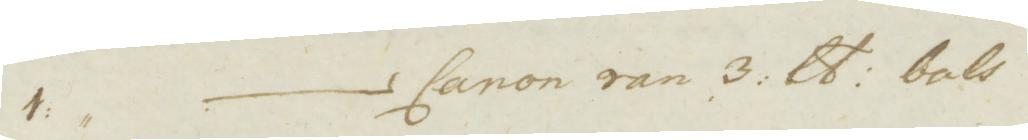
1: „ _o Canon van 3: lb: bals
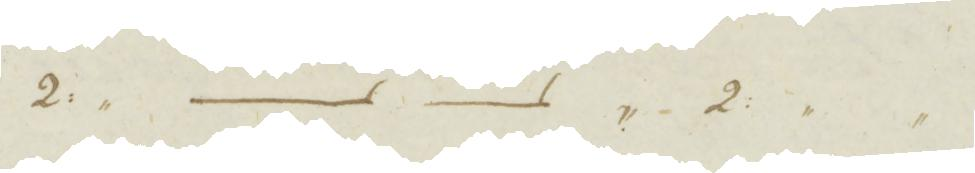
2: „ _o _o „ 2: „ „
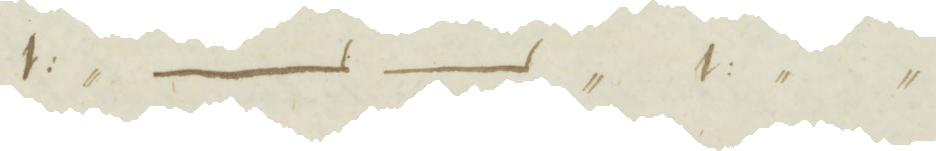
1: „ _o _o „ 1: „ „
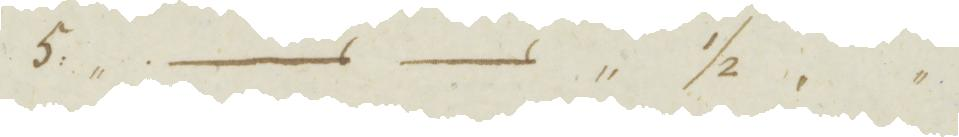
5: „ _o _o „ ½ „ „
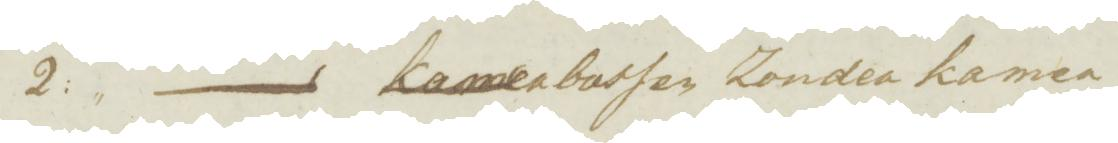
2:„ _o kamerbassen zonder kamer
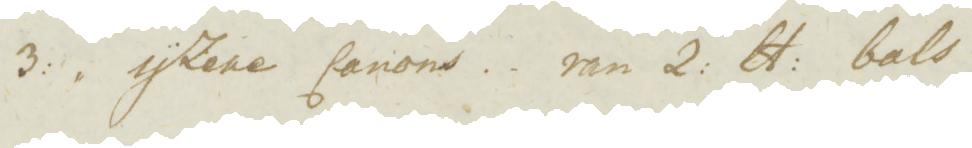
3: „ ijzere canons. - van 2: lb: bals
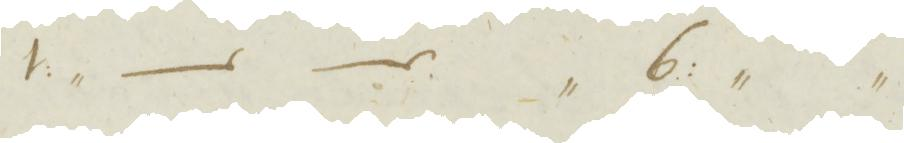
1: „ _o _o „ 6: „ „
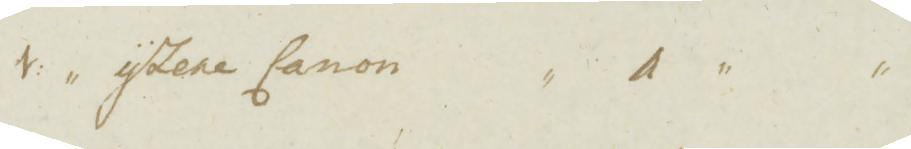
1: „ ijzere canon „ 4 „ „
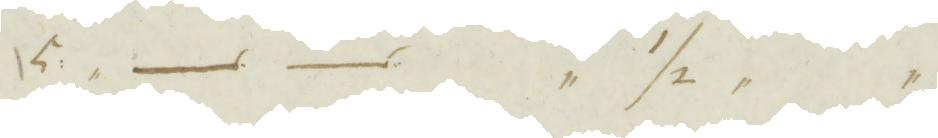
15: „ _o _o „ ½ „ „
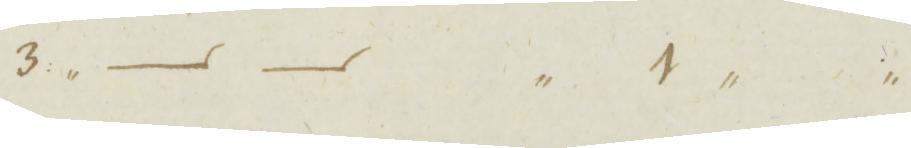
3: „ _o _o „ 1 „ „
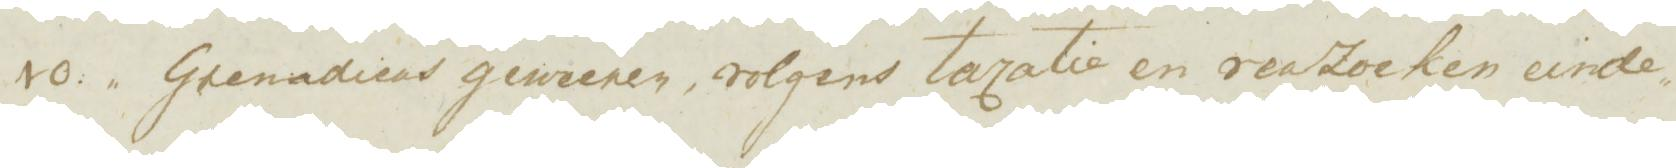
10: „ Grenadiers geweeren, volgens taxatie en verzoeken einde„
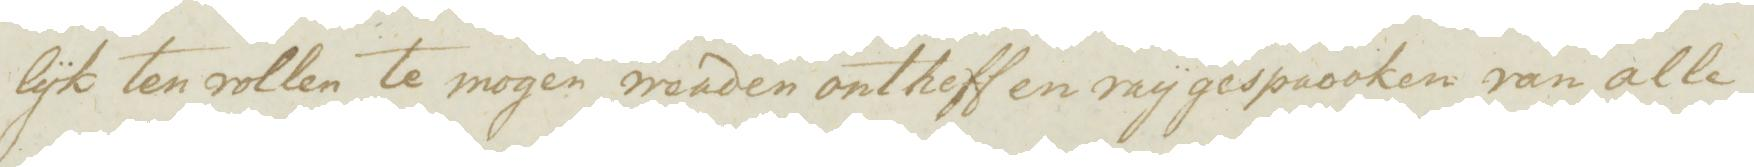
lijk ten vollen te mogen werden ontheff en vrij gesprooken van alle
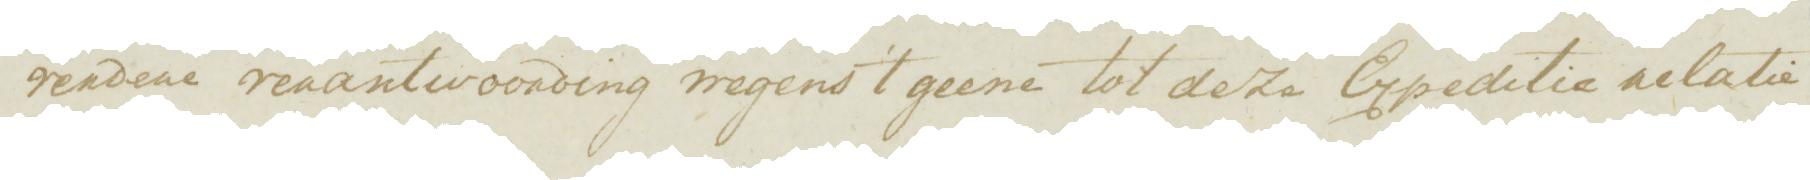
verdere verantwoording wegens ’t geene tot deze Expeditie relatie
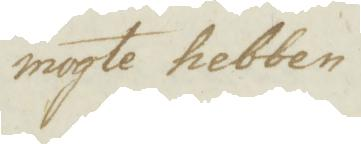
mogte hebben
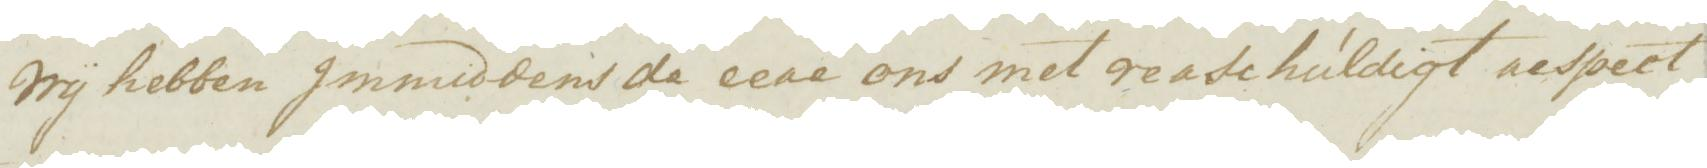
wij hebben Jmmiddens de eere ons met verschuldigt respect
